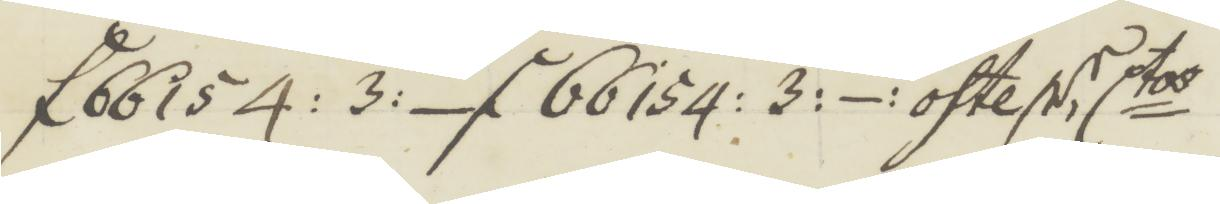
ƒ66154:3:—ƒ66154:3:—: ofte p:r C=tos
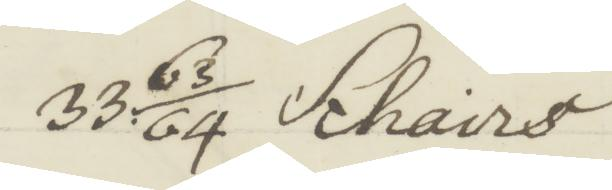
33 63/64 schairs
